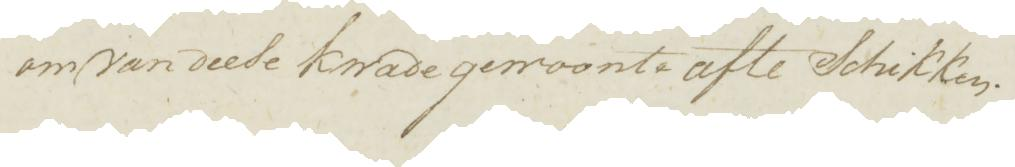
om van deese kwade gewoonte afte schikken.
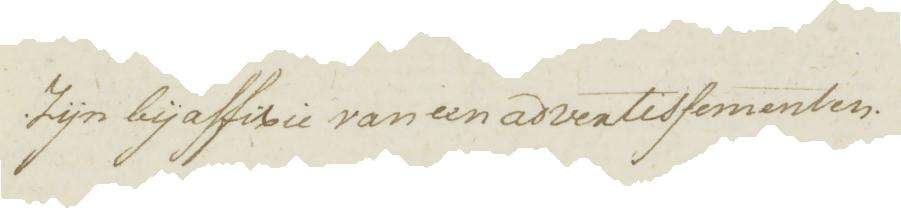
zijn bij affitie van een advertissementen.
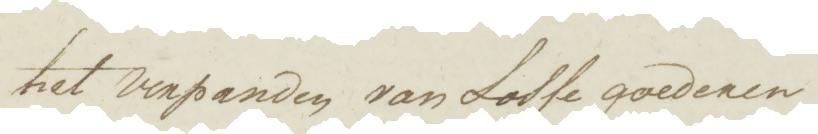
het verpanden van Losse goederen
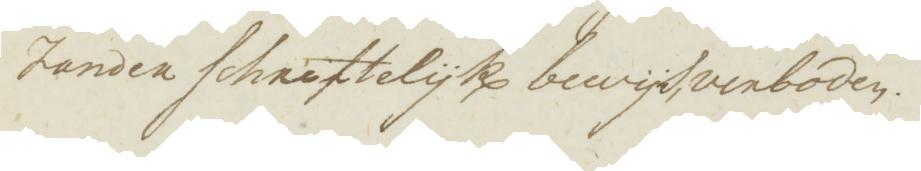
zonder schriftelijk bewijs, verboden.
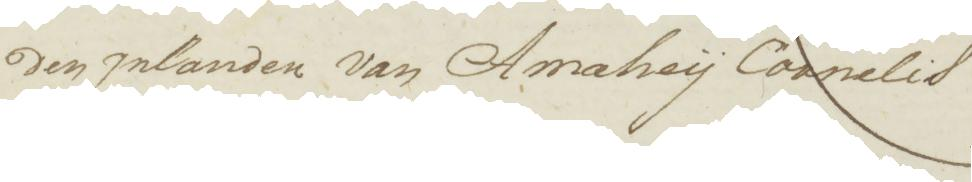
den jnlander van Amaheij Cornelis
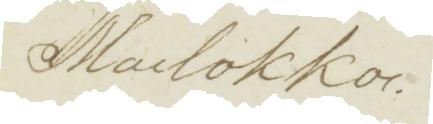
Mailokkor.
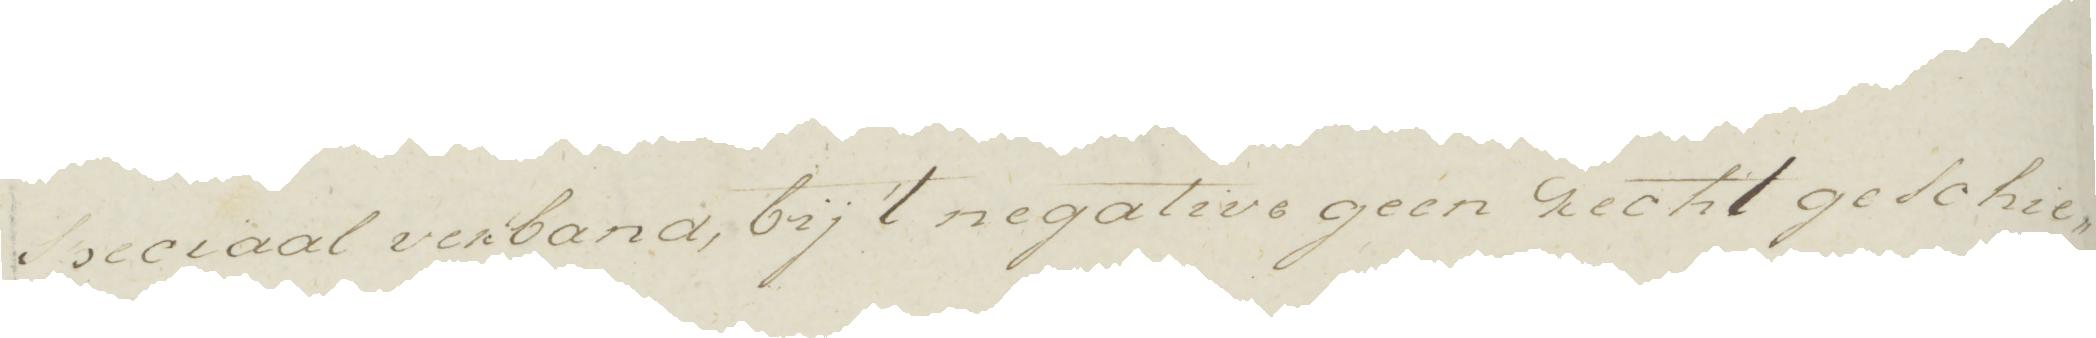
Speciaal verband, bij ’t negative geen recht geschie
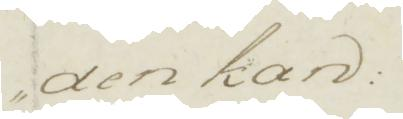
„den kan:
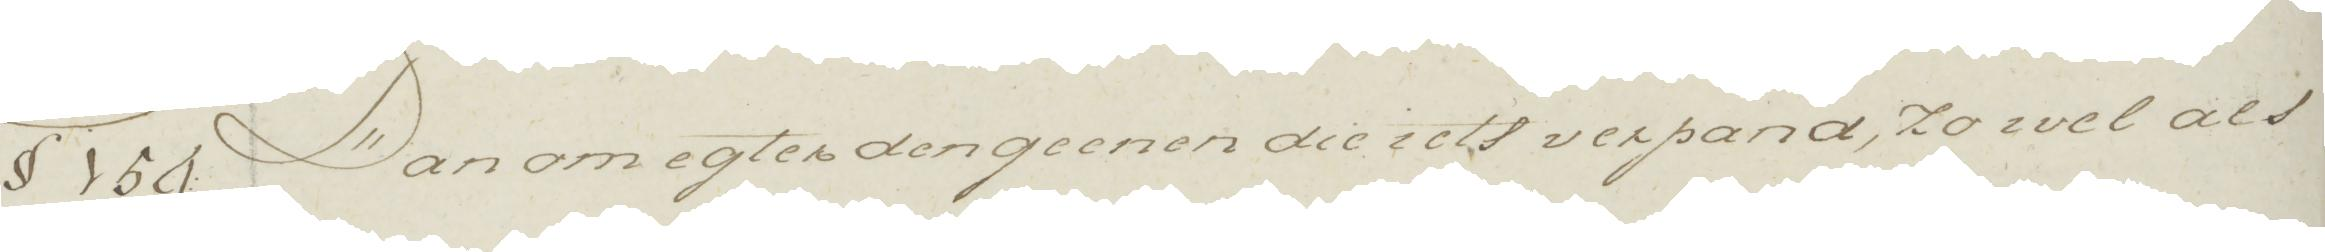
§: 154 Dan om egter den geenen die iets verpand, zo wel als
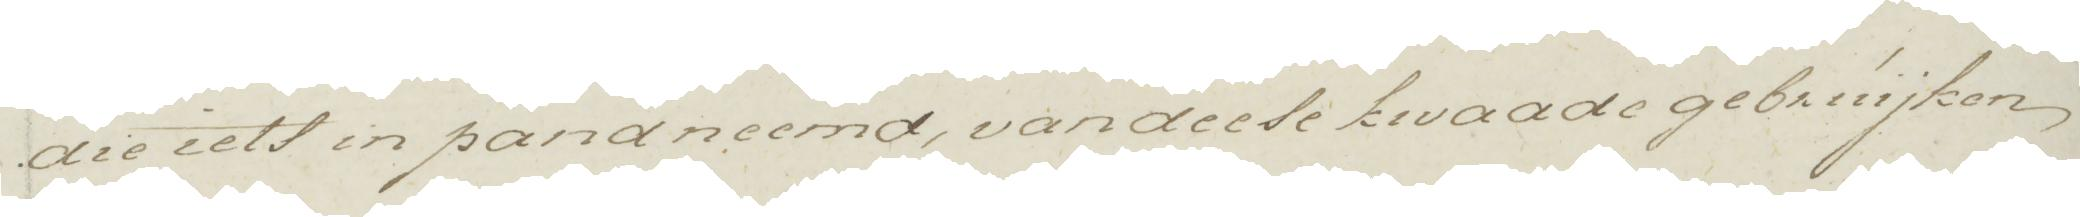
die iets in pand neemd, van deese kwaade gebruijken,
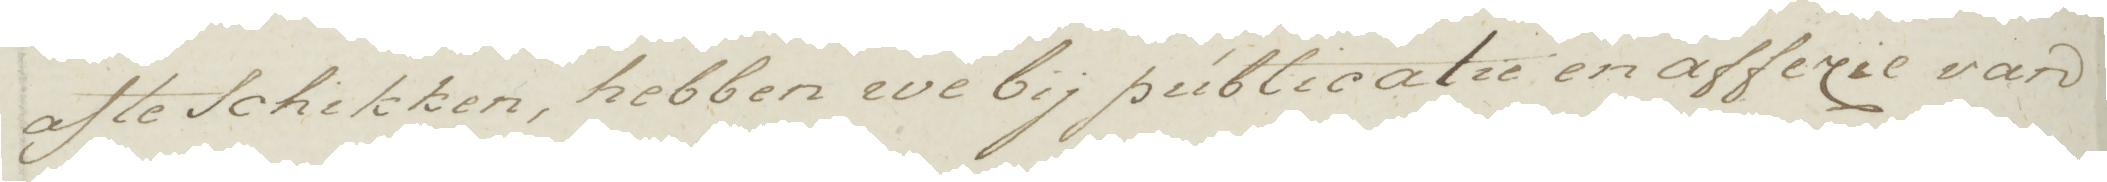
af te schikken, hebben we bij publicatie en affezie van
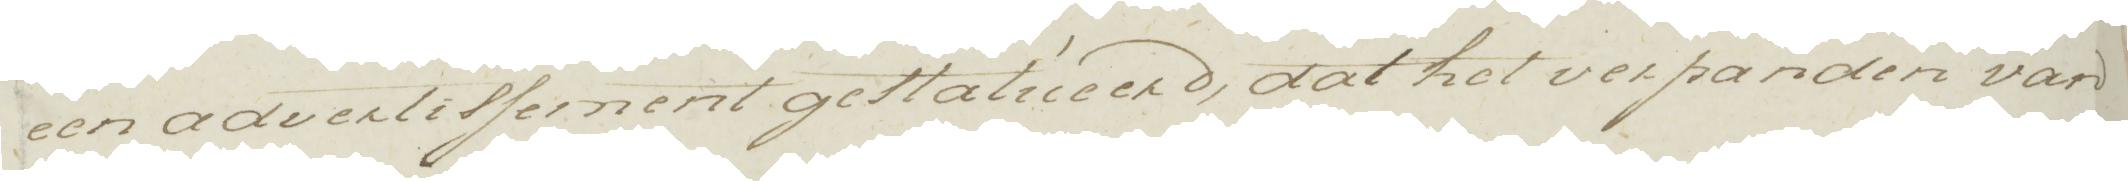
een advertissement gestatueerd, dat het verpanden van
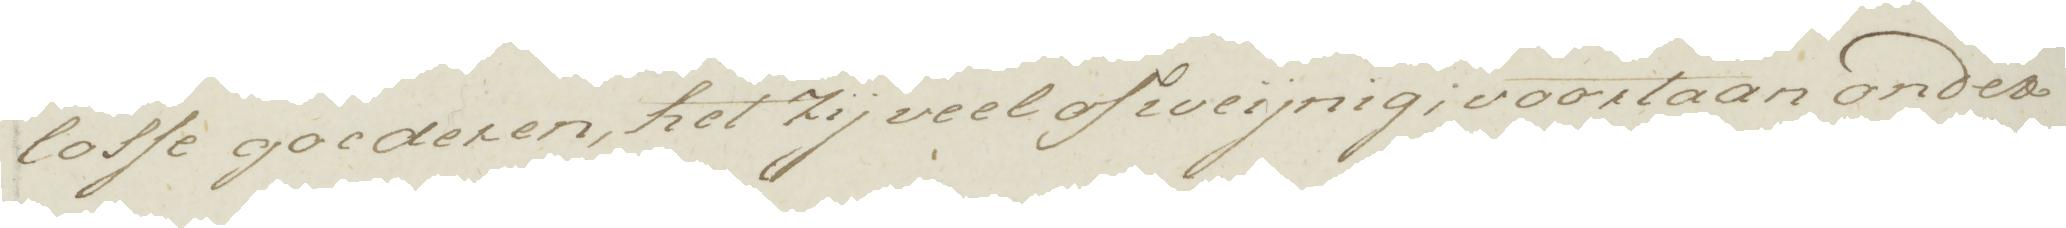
losse goederen, het zij veel of weijnig; voortaan onder
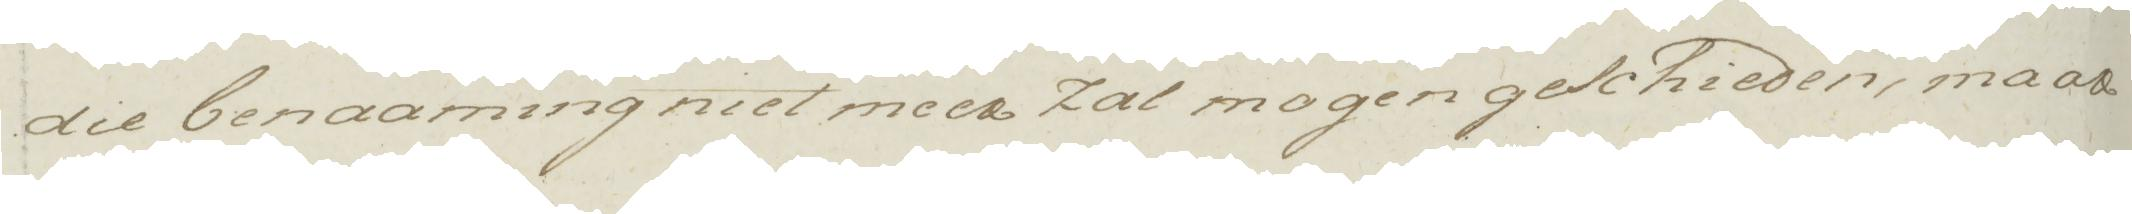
die benaaming niet meer zal mogen geschieden, maar
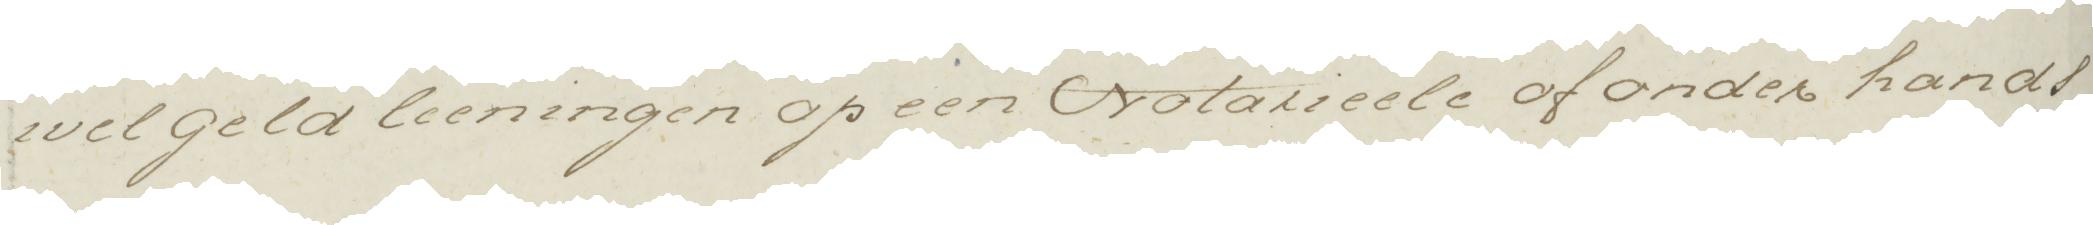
wel geld leeningen op een Notarieele of onder hands
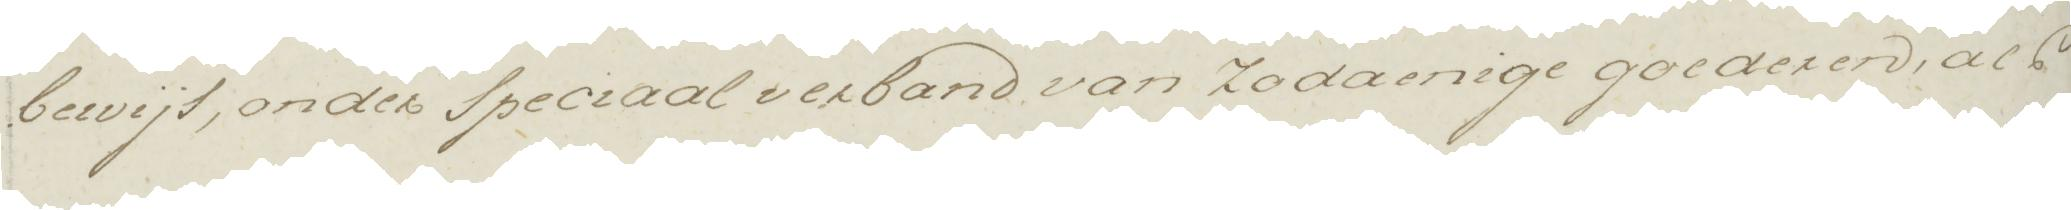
bewijs, onder speciaal verband van zodaenige goederen, als
